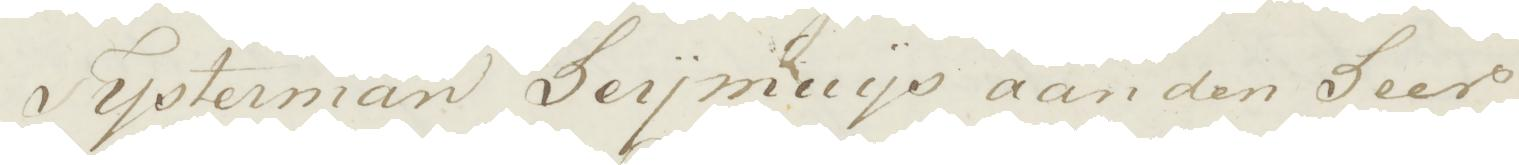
Fijsterman Heijmuijs aan den heer
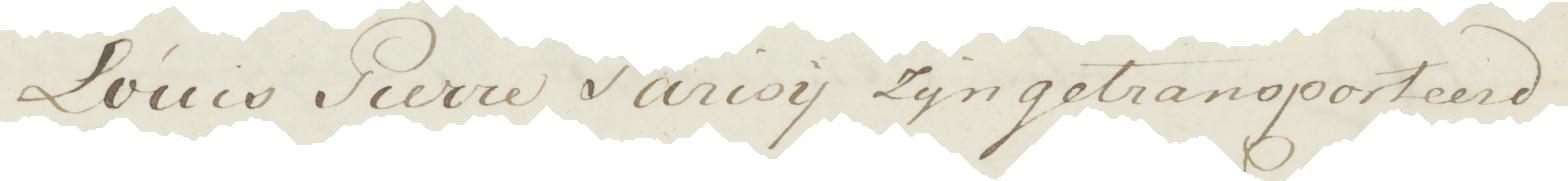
Louis Pierre Parisij zijn getransporteerd
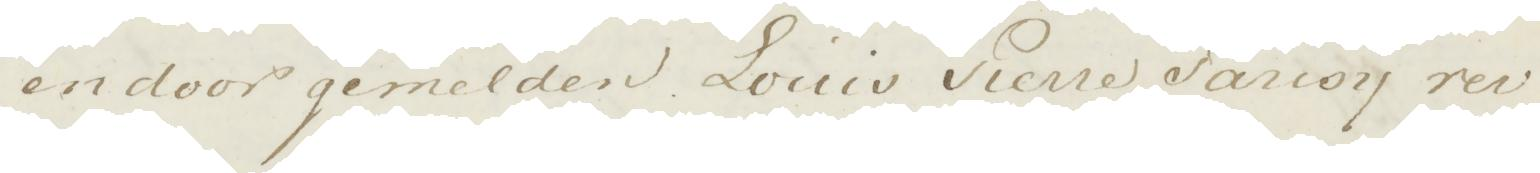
en door gemelden Louis Pierre Parisij ver
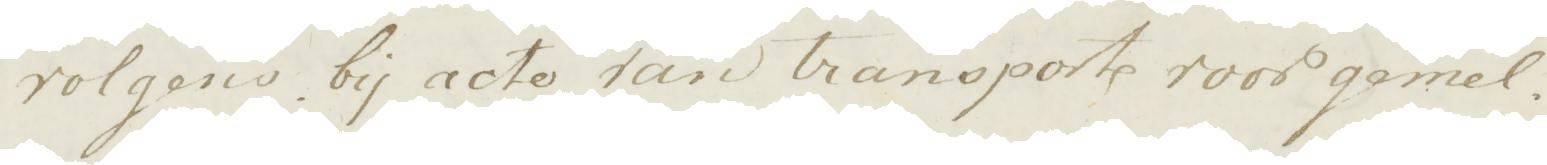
volgens bij acte van transporte voor gemel
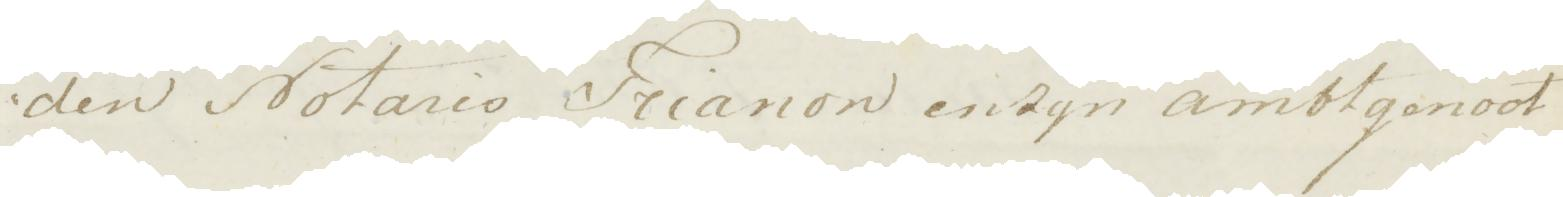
„den Notaris Trianon en zijn ambtgenoot
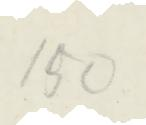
150.
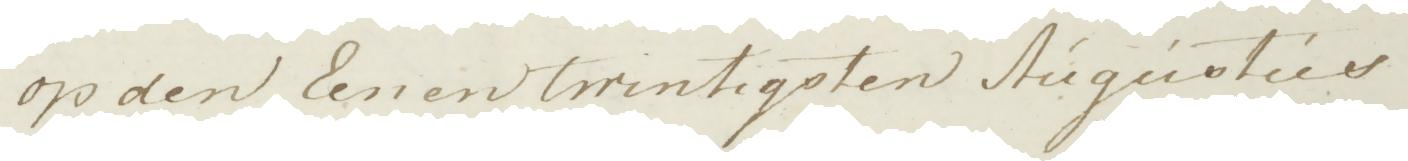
op den Een en twintigsten Augustus
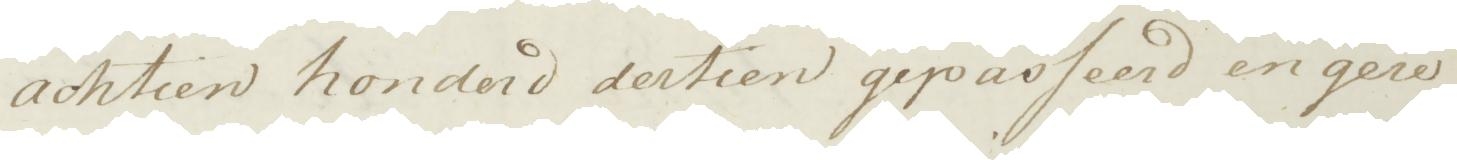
achtien honderd dertien gepasseerd en gere
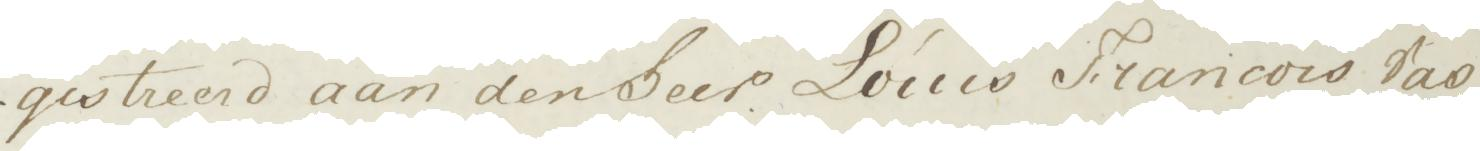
gistreerd aan den Heer Louis Francois Vas
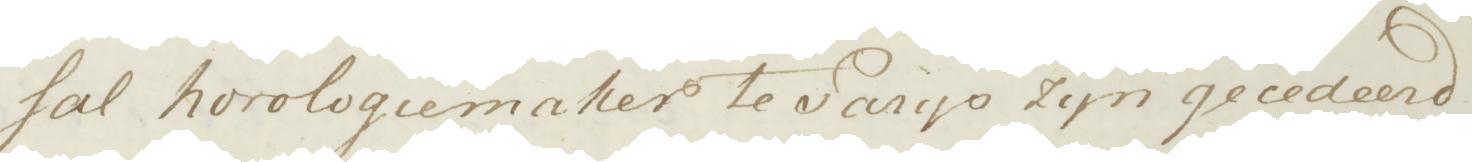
sal horologiemaker te Parijs zyn gecedeerd
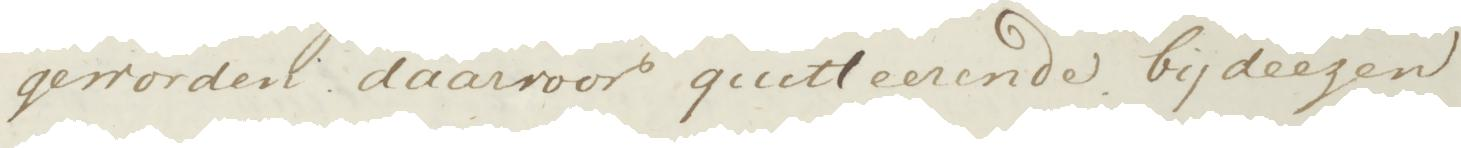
geworden . daarvoor quitteerende by deezen
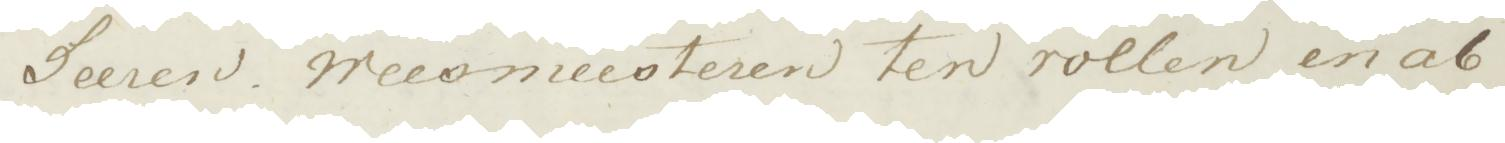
Heeren. weesmeesteren ten vollen en ab
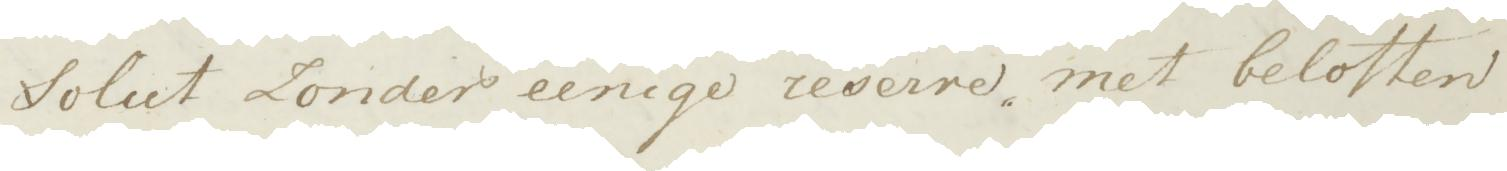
solut zonder eenige reserve, met beloften
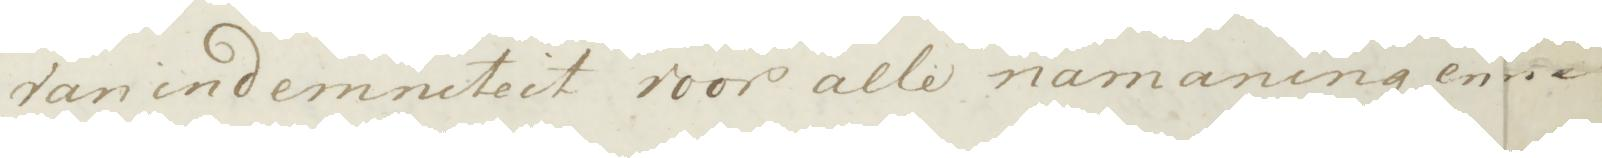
van indemniteit voor alle namaning enne
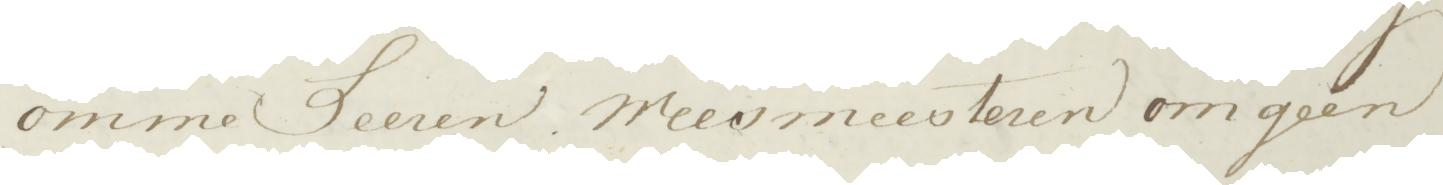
omme Heeren, weesmeesteren om geen
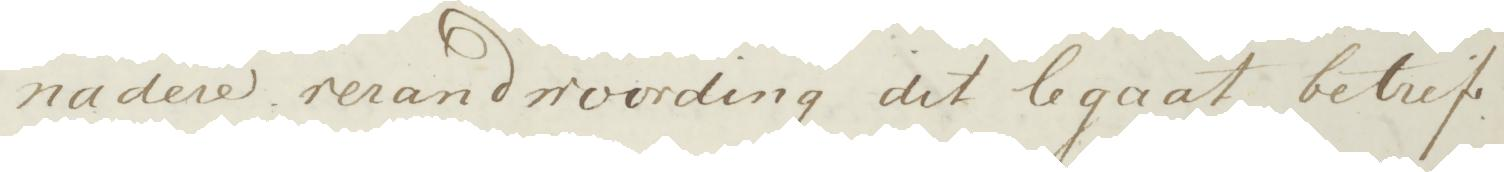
nadere verandwoording dit legaat betref„
